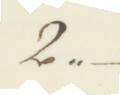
2„-
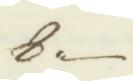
8„—
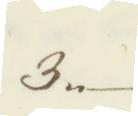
3„—
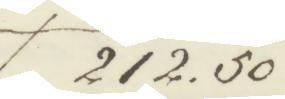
ƒ 212. 50
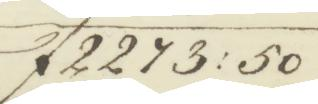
ƒ2273: 50
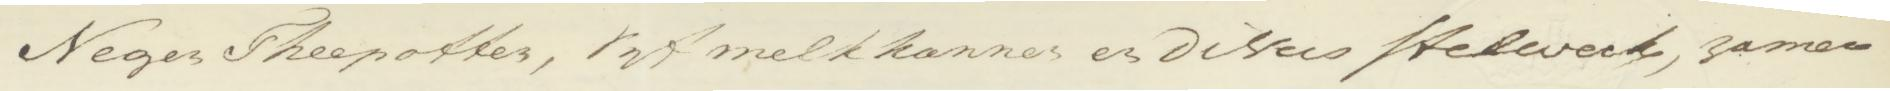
Negen Theepotten, vyf melkkannen en divers stelwerk, zamen
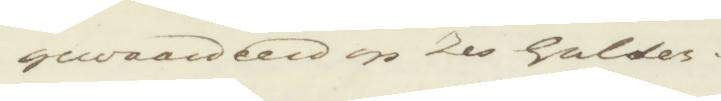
gewaardeerd op zes Gulden
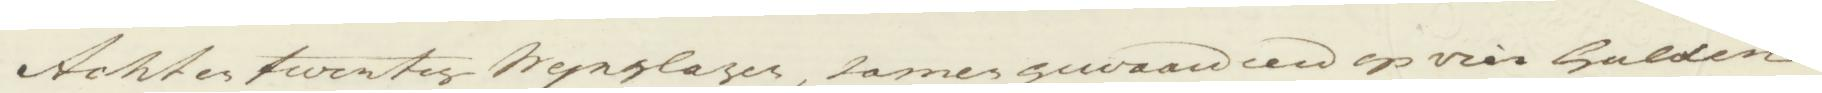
Acht en twintig Wynglazen, zamen gewaardeerd op vier Gulden
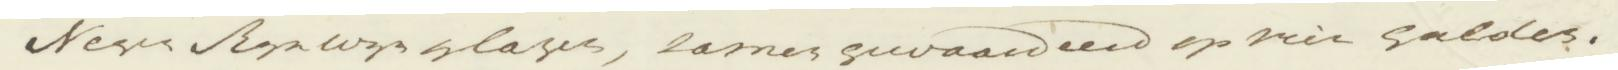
Negen Rynwyn glazen, zamen gewaardeerd op vier gulden.
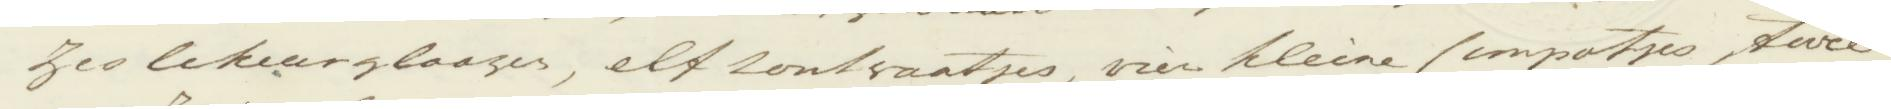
Zes likeurglaazen, elf zoutvaatjes, vier kleine Compotjes, twee
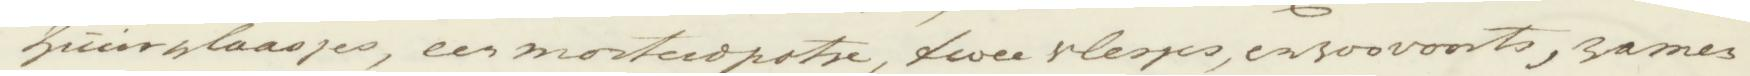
Zuurglaasjes, een mosterdpotje, twee vlesjes, enzoovoorts, zamen
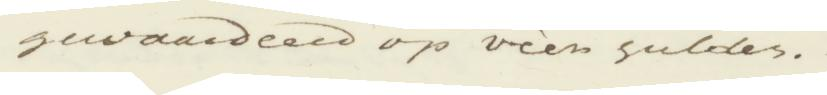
gewaardeerd op vier gulden.
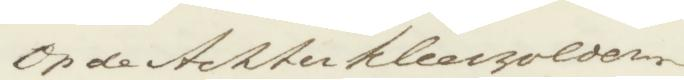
Op de Achter kleerzolder
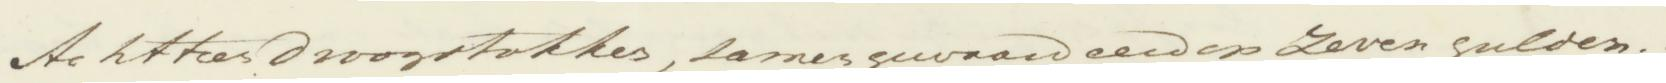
Achttien droogstokken, zamen gewaardeerd op zeven gulden.
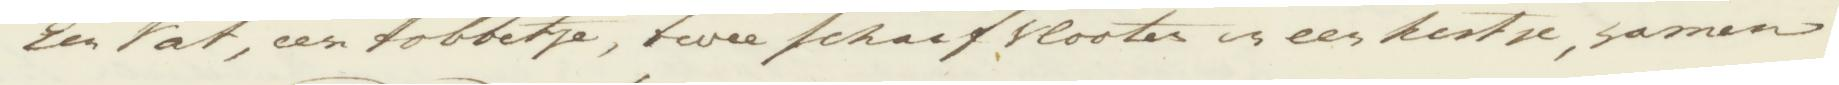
Een Vat, een tobbetje, twee schaaf vlooten in een kistje, zamen
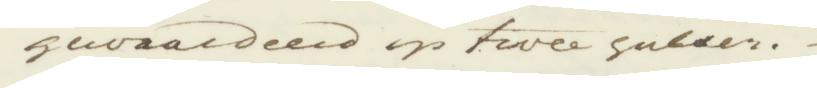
gewaardeerd op twee gulden.
